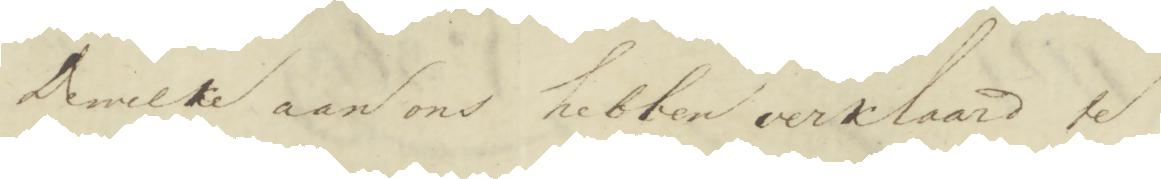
Dewelke aan ons hebben verklaard te
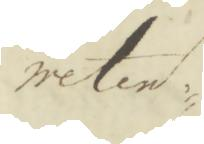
weten,:
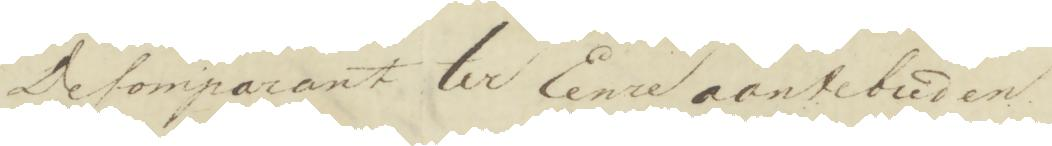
De Comparant ter Eenre aantebieden
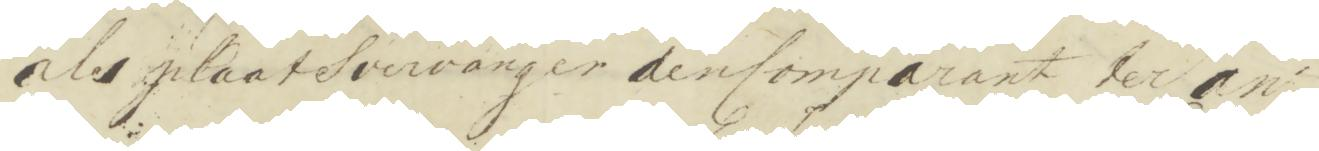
als plaatsvervanger den Comparant ter an:
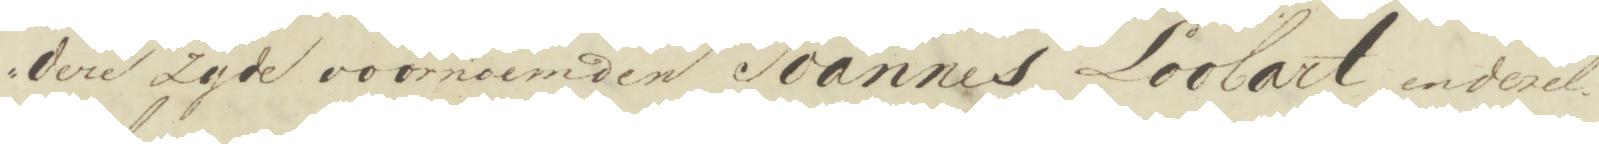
„dere zyde voornoemden Ioannes Loobart en dezel„
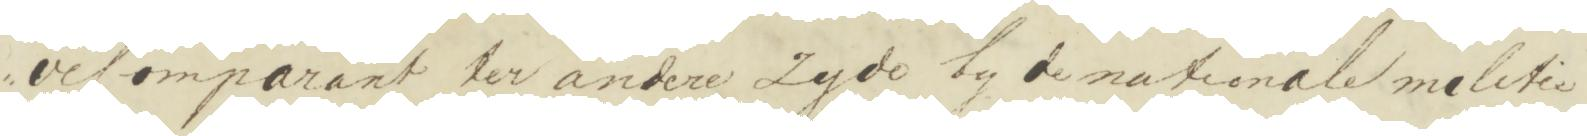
„ve Comparant ter andere zyde by de nationale militie
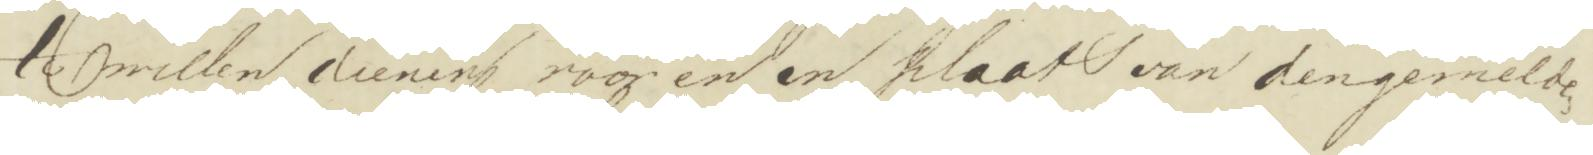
te willen dienen voor en in plaats van den gemelde
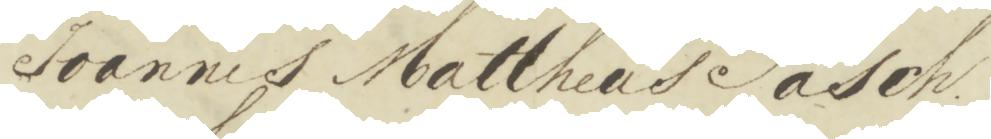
Ioannes Mattheas Pasch.
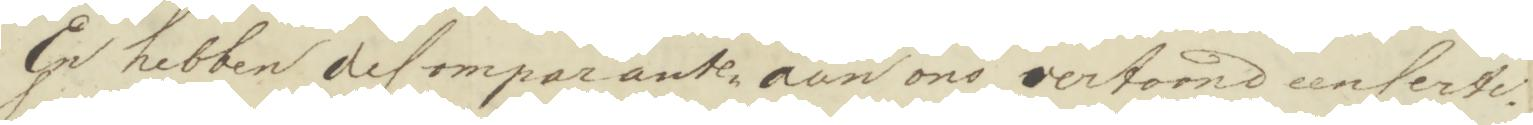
En hebben de Comparanten aan ons vertoond een Certe„
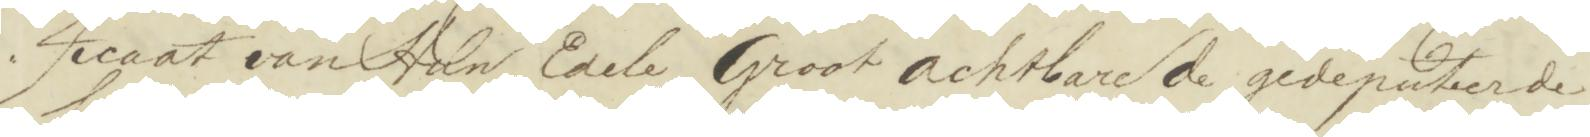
„ficaat van Hun Edele Groot achtbare de gedeputeerde
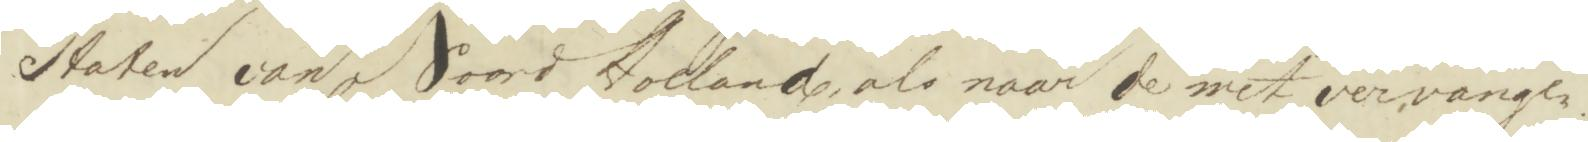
Staten van Noord Holland, als naar de wet vervangen
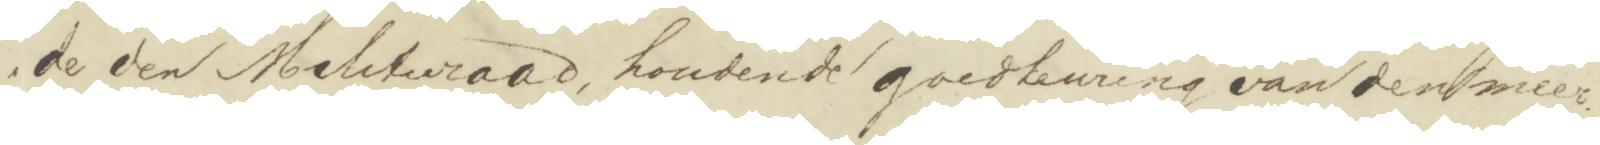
„de den Militieraad, houdende goedkeuring van den meer.
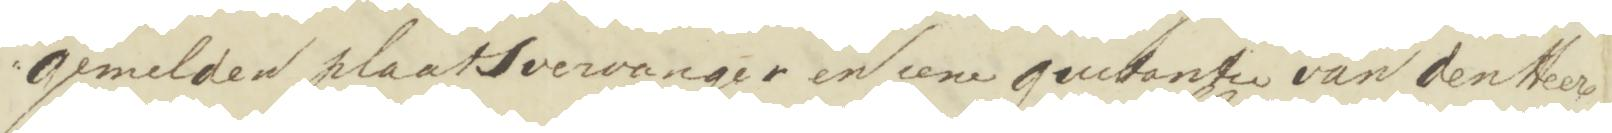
„gemelden plaatsvervanger en eene quitantie van den Heer
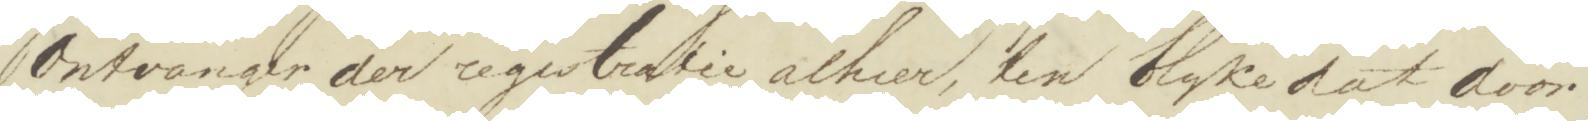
Ontvanger der registratie alhier, ten blyke dat door
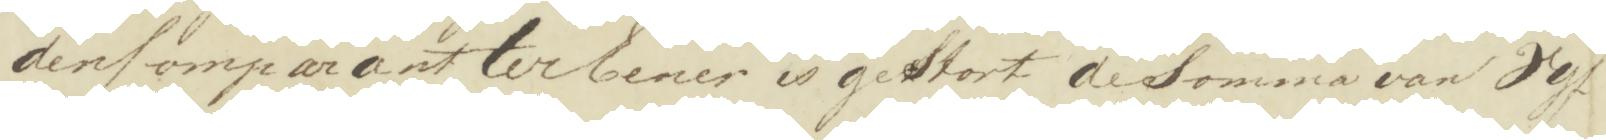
den Comparant ter Eener is gestort de somma van Vyf
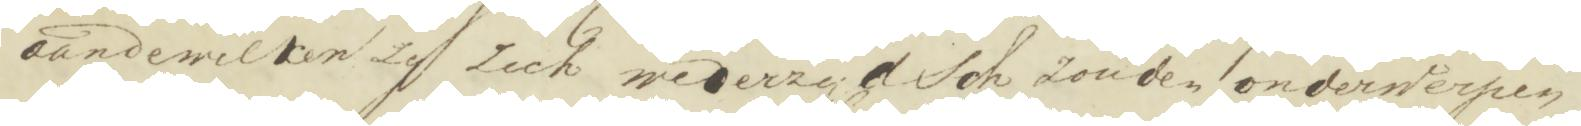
aandewelken zy zich wederzydsch zouden onderwerpen
